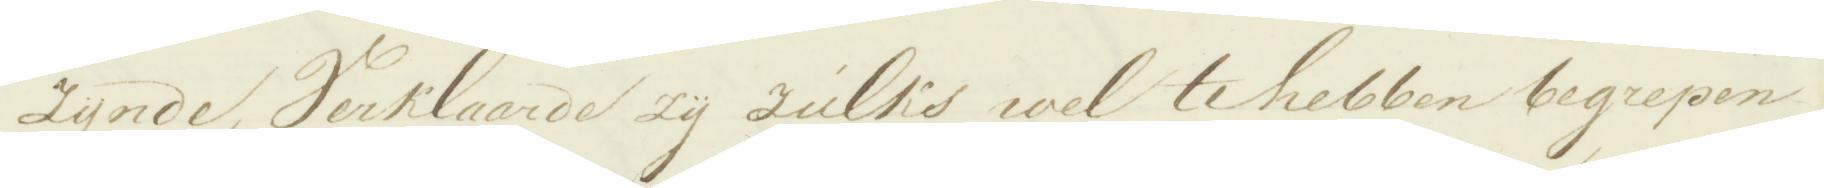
zijnde, Verklaarde zij zulks wel tehebben begrepen
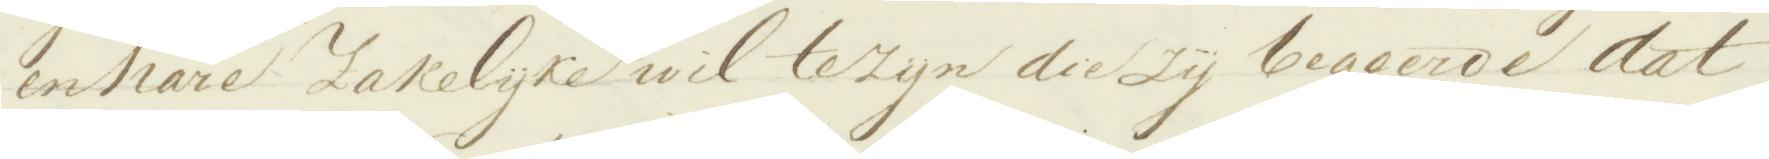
enhare Zakelijke wil tezijn die zij begeerde dat
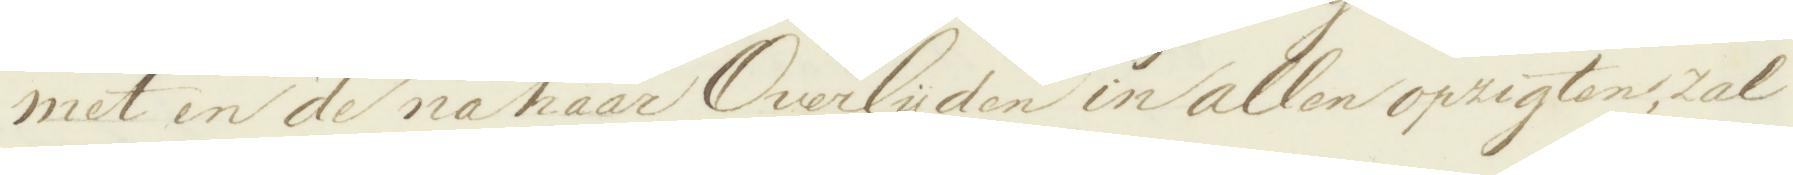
met en de nahaar Overlijden in allen opzigten, zal
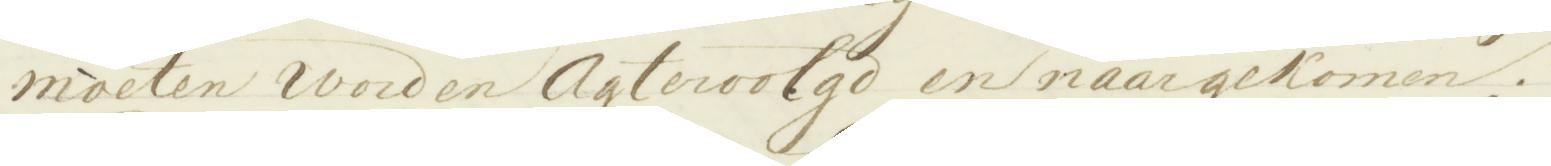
moeten worden Agtervolgd en naargekomen.
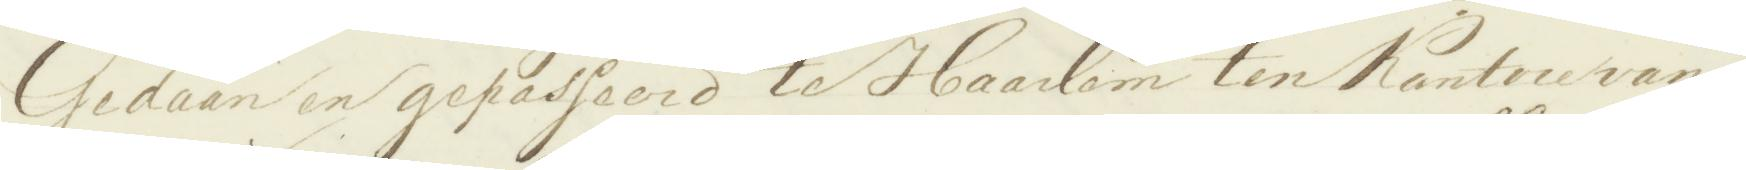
Gedaan en gepasseerd teHaarlem tenKantore van
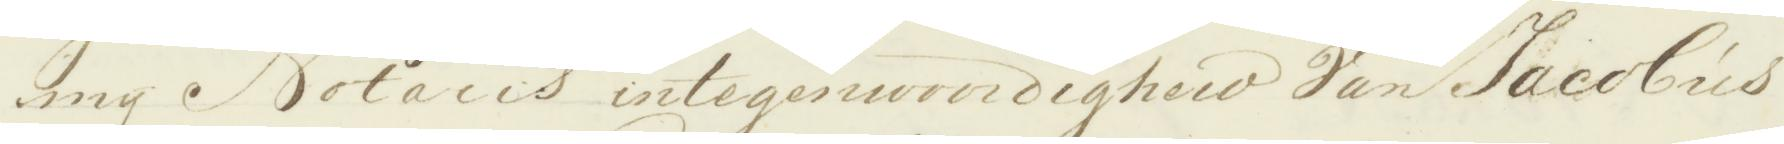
mij Notaris in tegenwoordigheid van Jacobus
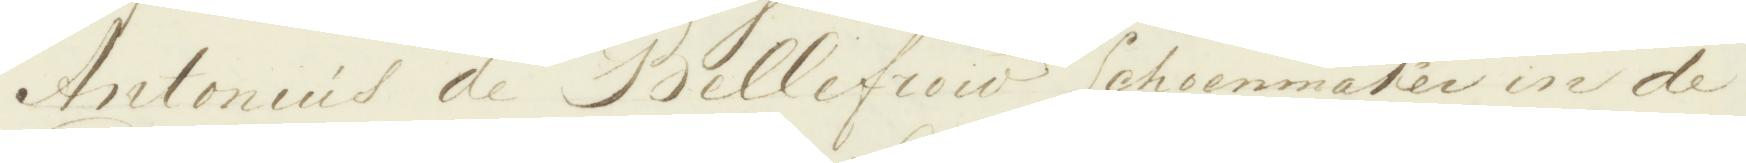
Antonius de Bellefroid schoenmaker in de
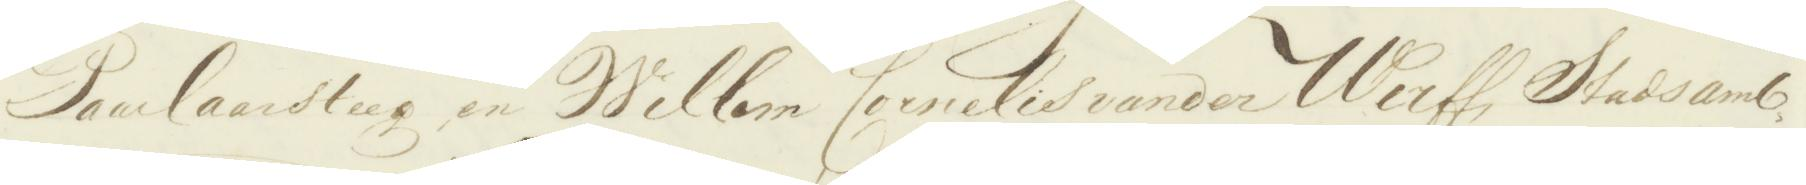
Paarlaarsteeg en Willem Cornelis vander Werff, Stads amb„
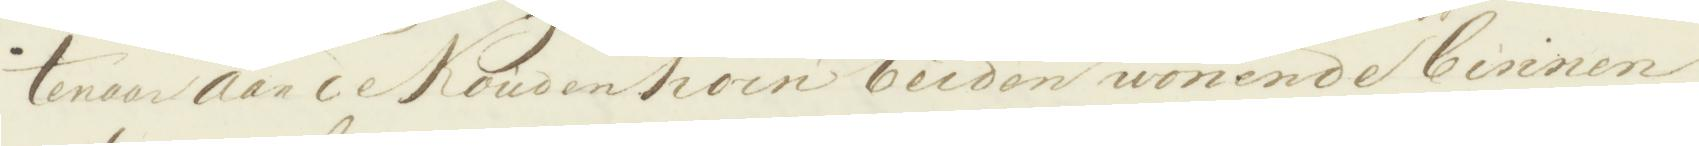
tenaar aan de Koudenhorn beiden wonende binnen
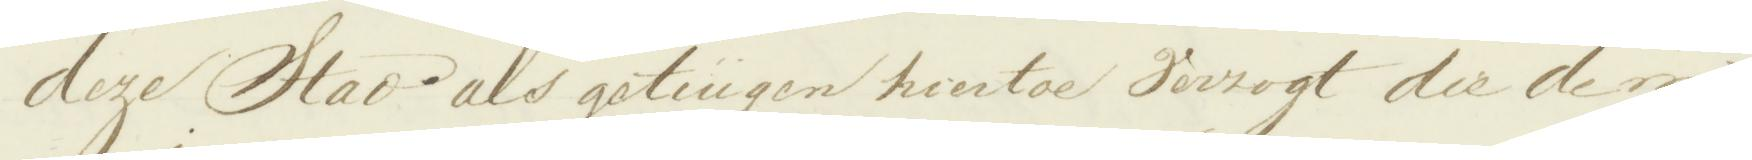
deze Stad als getuigen hiertoe verzogt die de mi
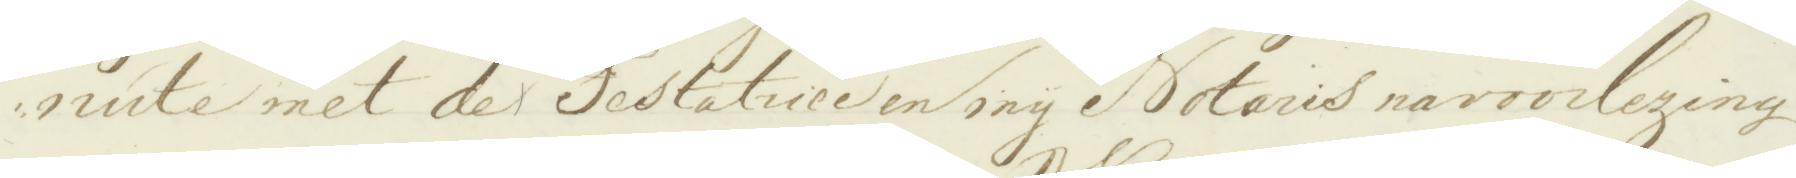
„nute met de Testatrice en mij Notaris navoorlezing
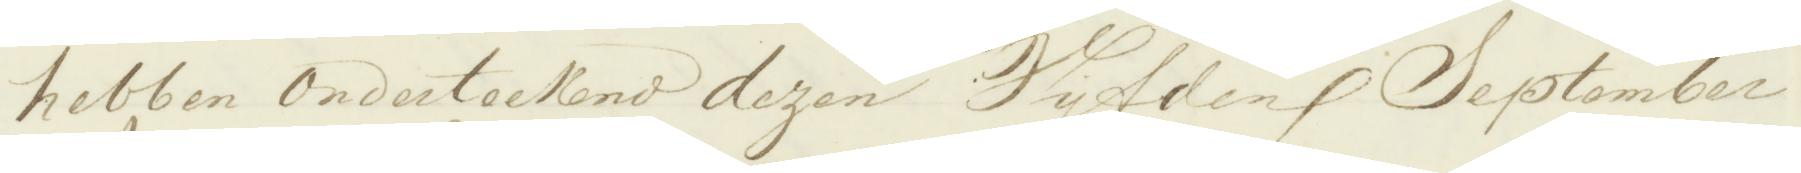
hebben onderteekend dezen Vijfden September
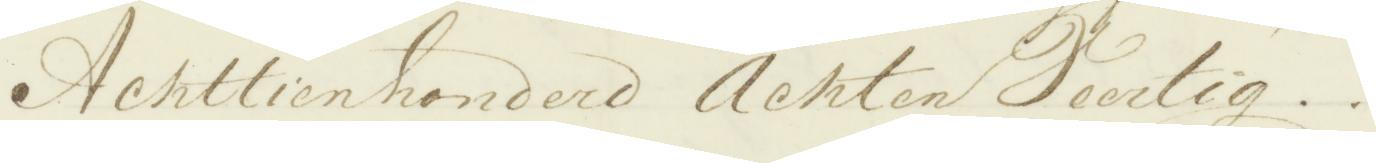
Achttienhonderd Acht en Veertig..
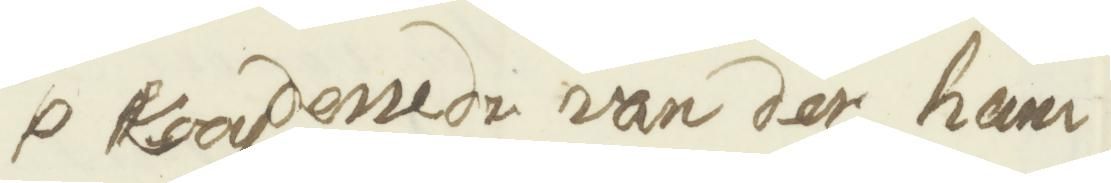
P Kooy dewedu van der ham
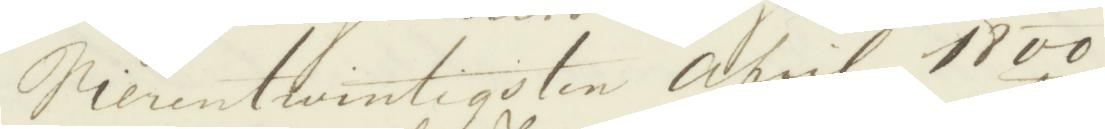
Vierentwintigsten April 1800
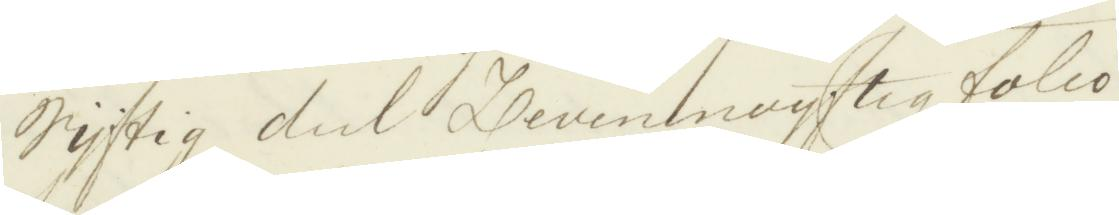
Vijftig deel Zevenenvyftig folio
